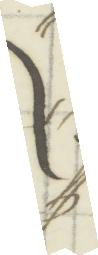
H
